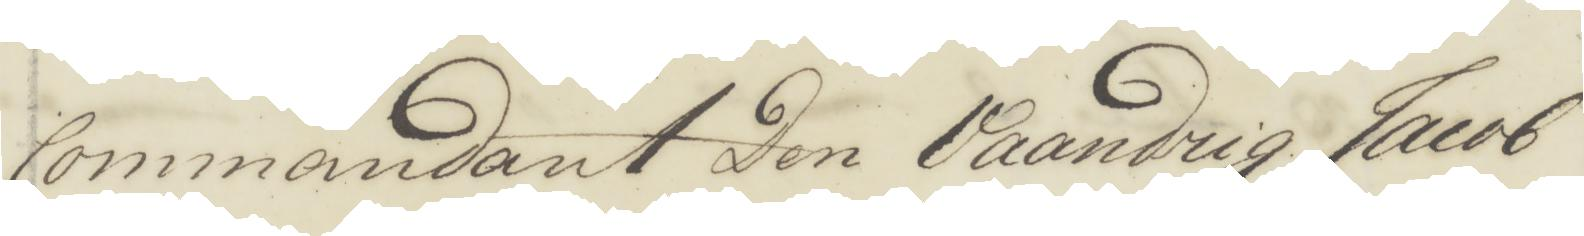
Commandant Den Vaandrig Jacob
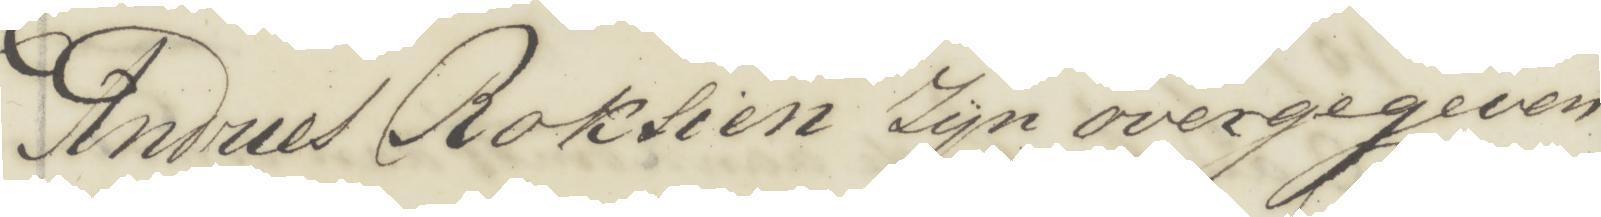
Andries Roksien zijn overgegeven
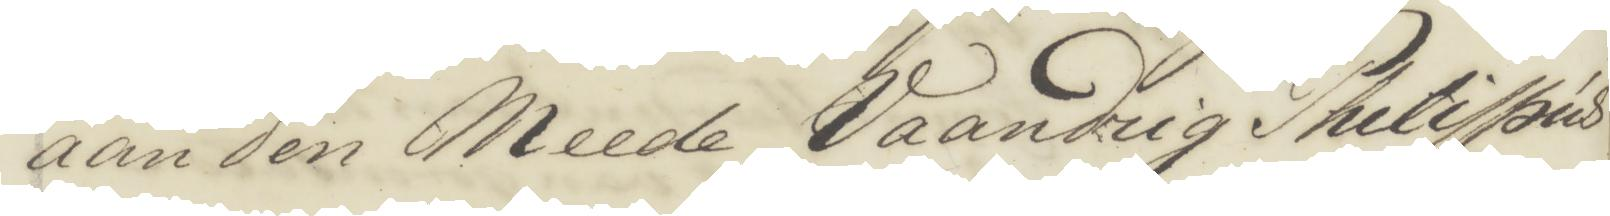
aan den meede Vaandrig Philippus
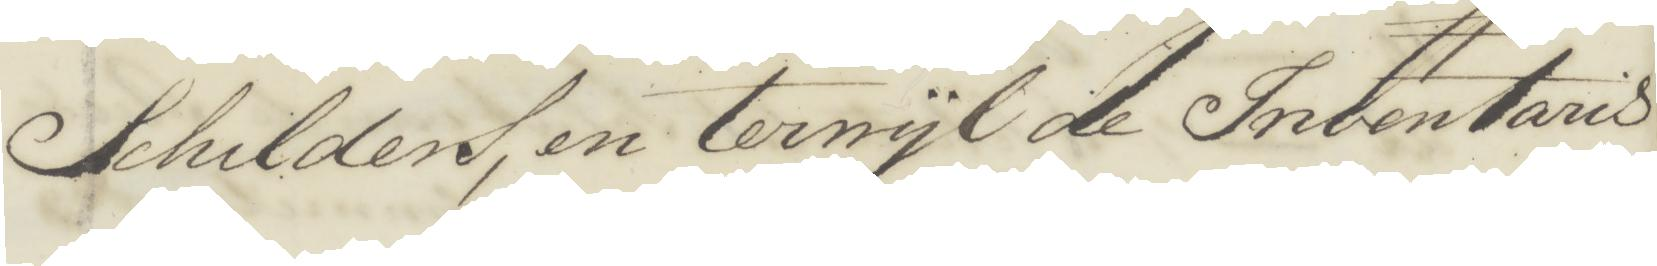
Schilders, en terwijl de Inventaris
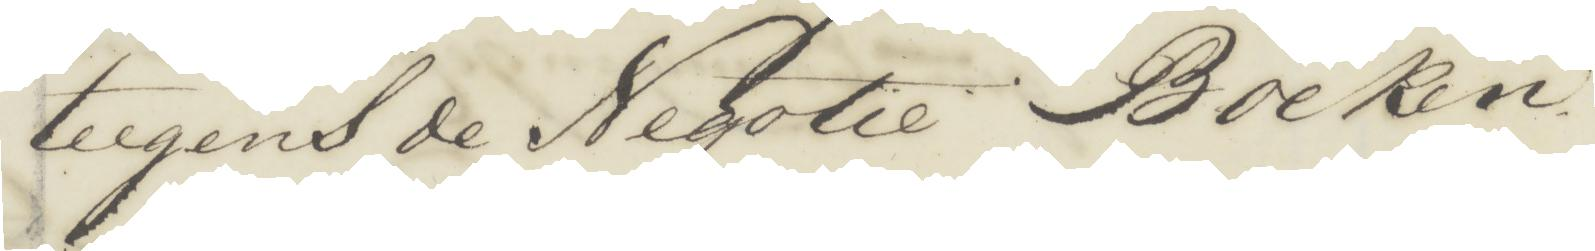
teegens de Negotie Boeken
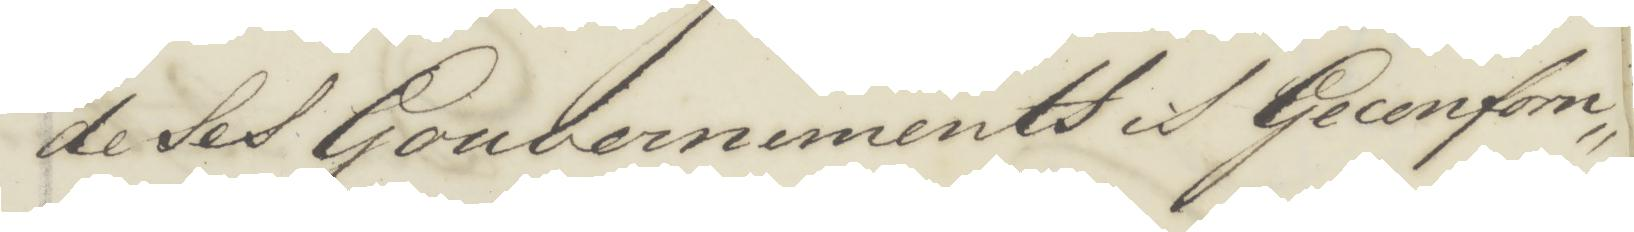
deses Gouvernements is Geconfom„
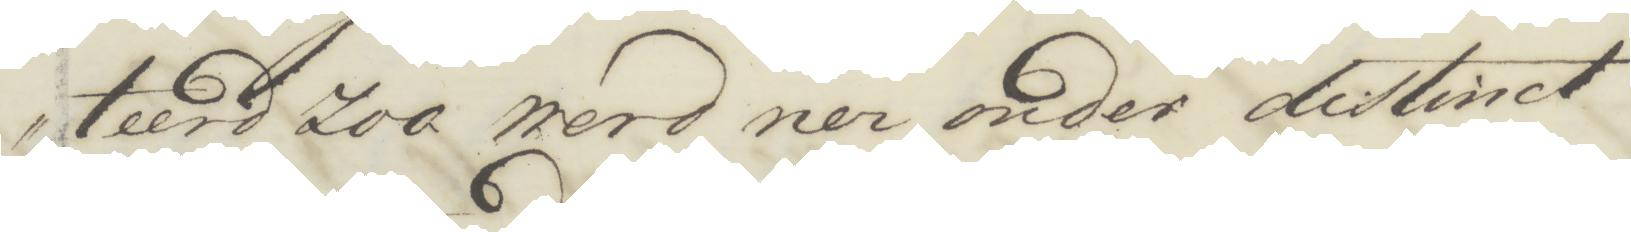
„teerd zoo werd ner onder distinct
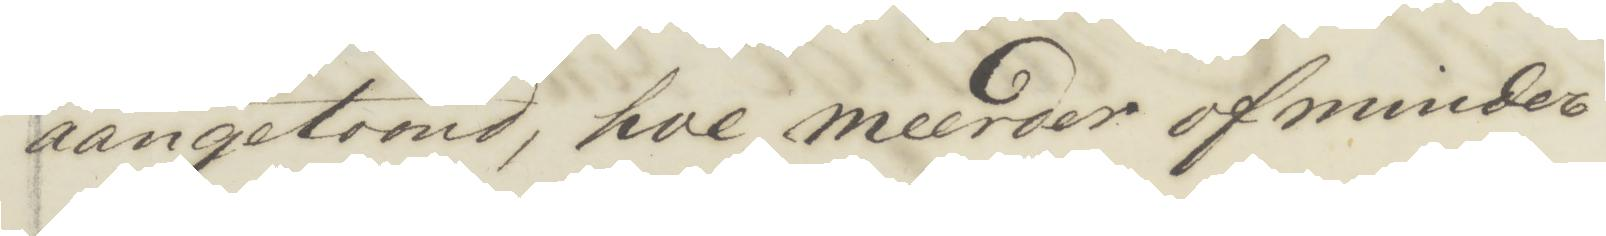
aangetoond, hoe meerder of minder
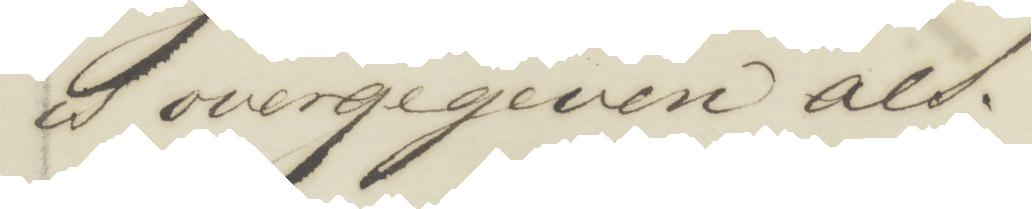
is overgegeven als.
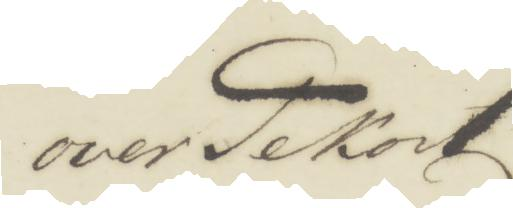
over Tekort
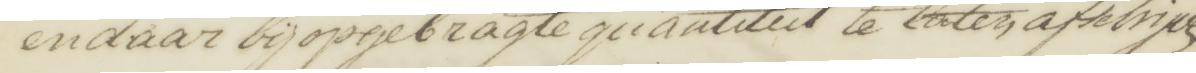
en daar bij opgebragte quantiteit te laten afschrijven
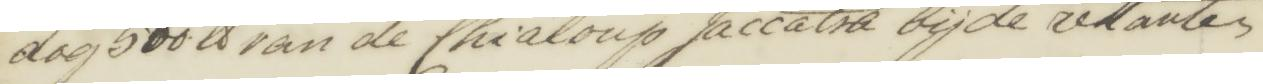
dog 550lb van de Chialoup jaccatra bij de restanten
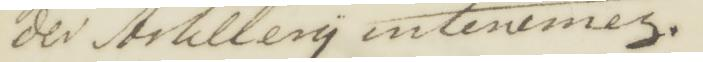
der Artillerij intenemen.
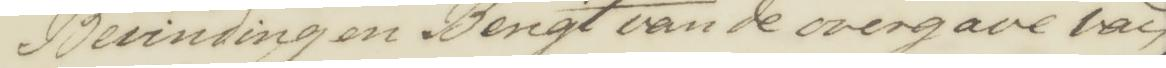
Bevinding en Berigt van de overgave van
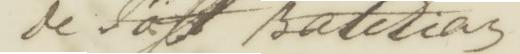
de Post Batchian
